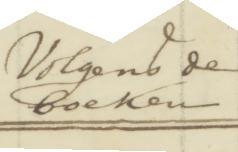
Volgens de
